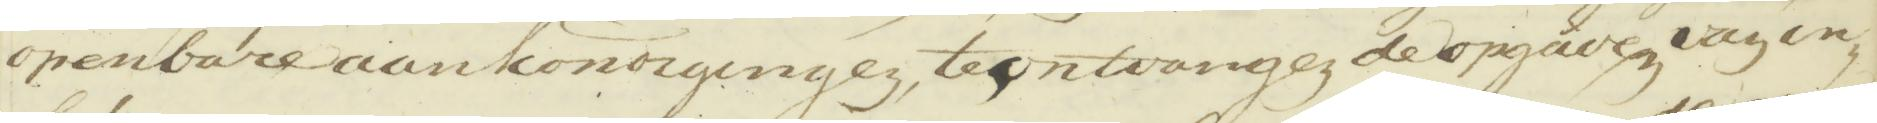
openbare aankondigingen, te ontvangen de opgaven van in„
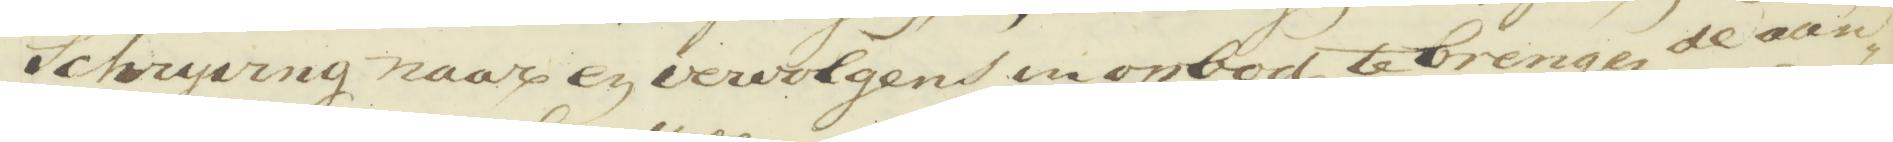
schryving naar en vervolgens in opbod te brengen de aan„
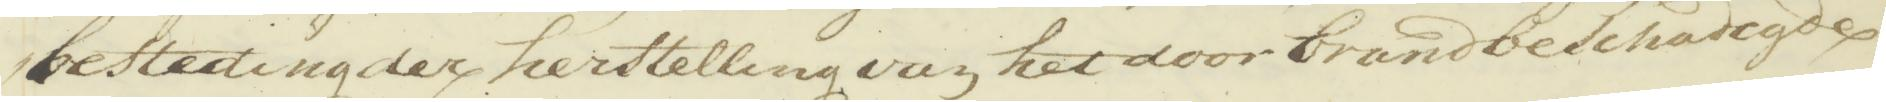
„besteding der herstelling van het door brand beschadigde
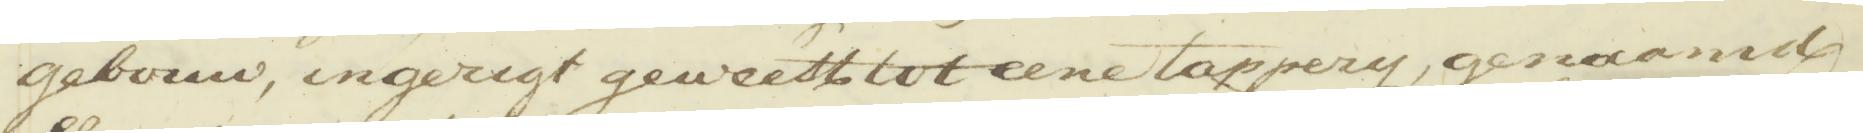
gebouw, ingerigt geweest tot eene tappery, genaamd
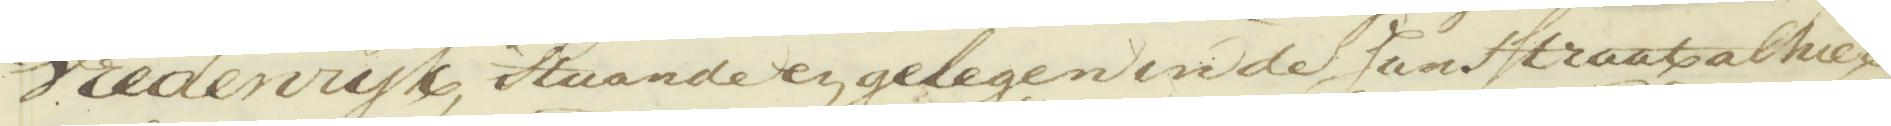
Vredenryk, staande en gelegen in de Jansstraat alhier
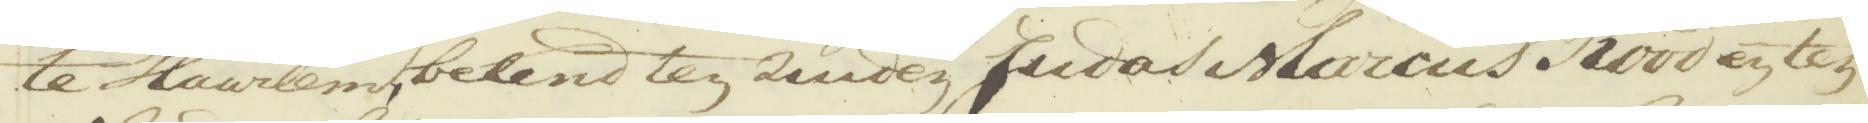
te Haarlem, belend ten zuiden Judas Marcus Rooden ten
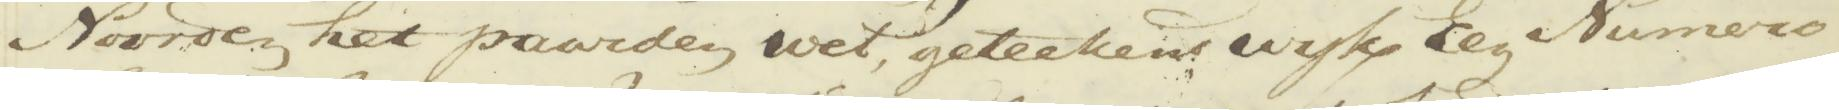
Noorden het paarden wet, geteekend wyk Een Numero
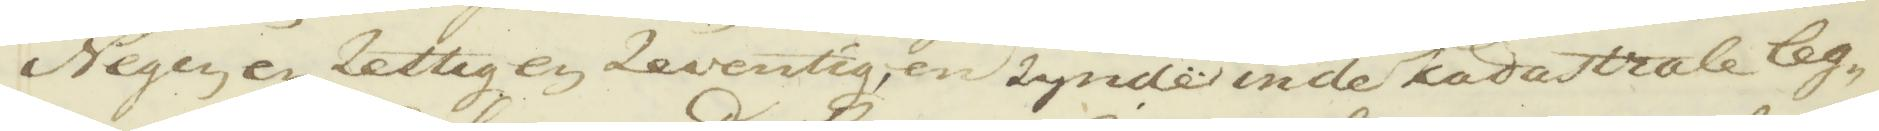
Negen en zestig en zeventig, en zynde in de kadastrale leg„
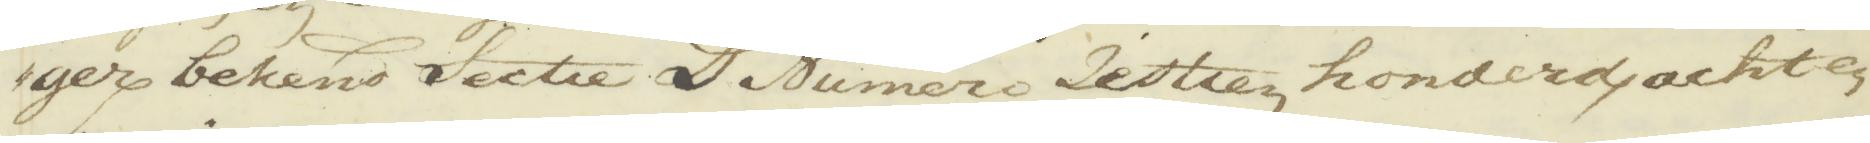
„ger bekend Sectie D Numero Zestien honderd acht en
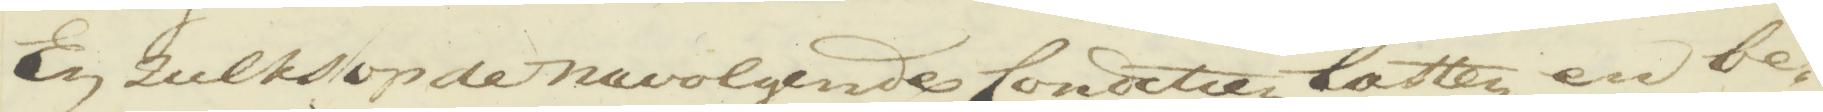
En zulks op de navolgende Conditien lasten en be„
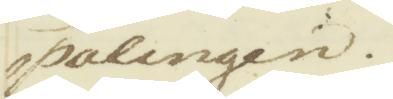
„palingen.
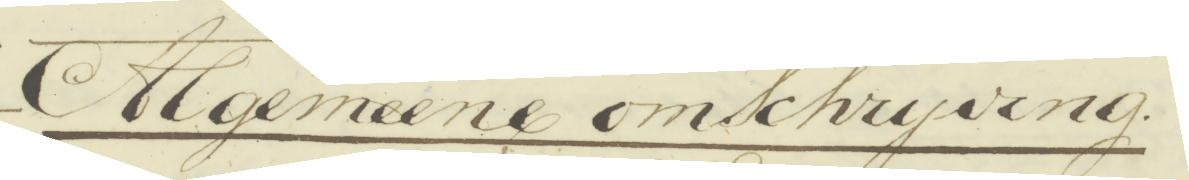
Algemeene omschryving.
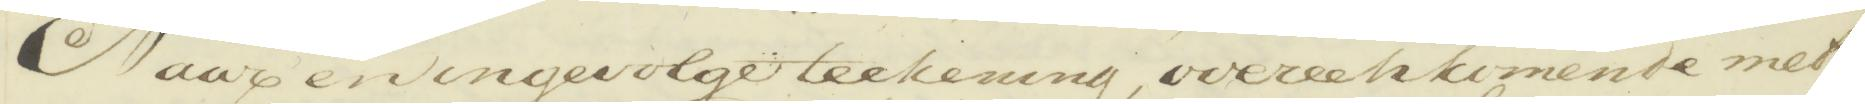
Naar en ingevolge teekening overeenkomende met
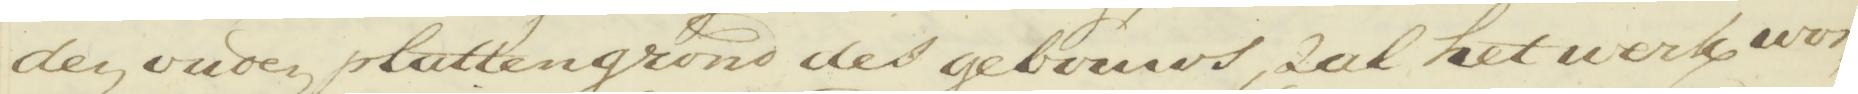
den ouden plattengrond des gebouws, zal het werk wor„
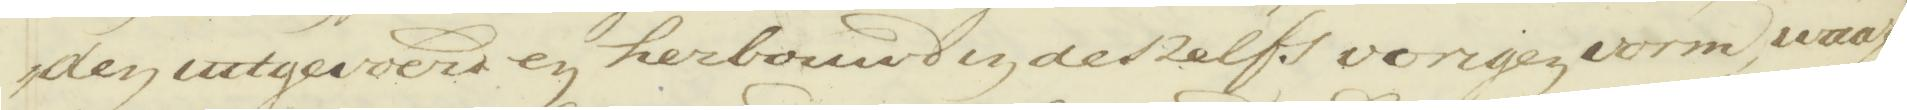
„den uitgevoerd en herbouwd in deszelfs vorigen vorm, waar
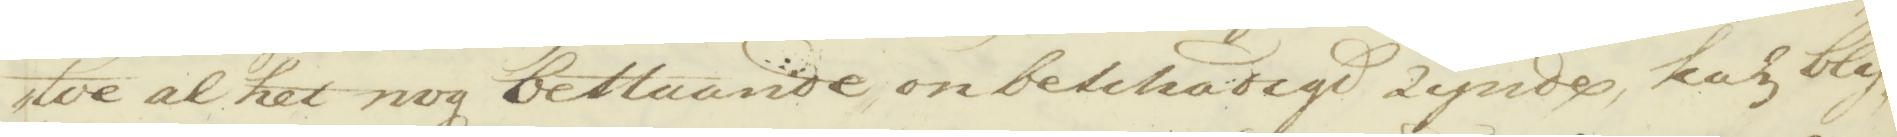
„toe al het nog bestaande onbeschadigd zynde, kan bly
